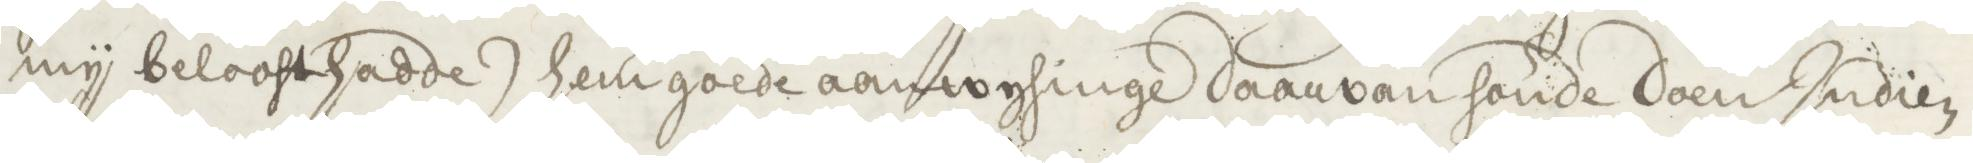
mij belooft hadde) hem goede aanwysinge daar van soude doen Jndien
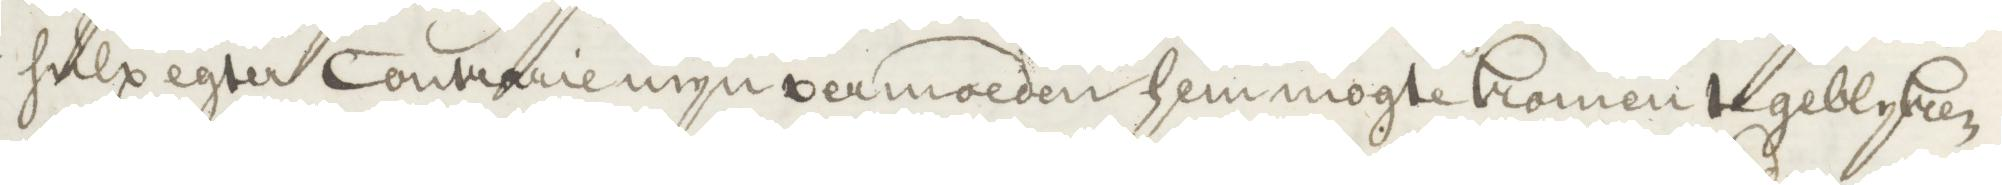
sulx egter Contrarie myn vermoeden hem mogte komen te geblyken
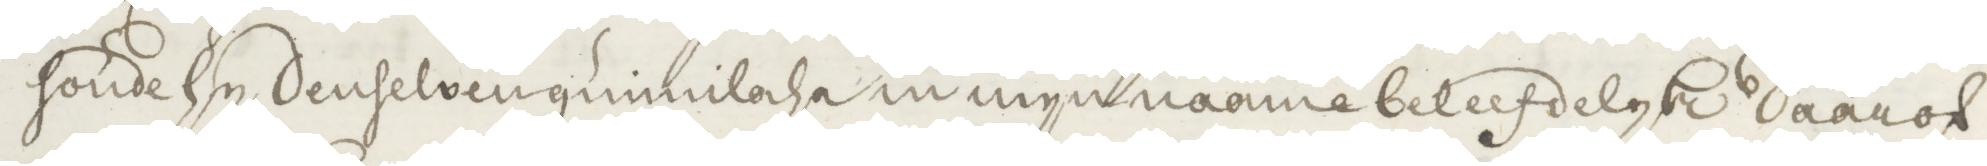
soude hy denselven quimilaha in myn naame beleefdelyk daarover
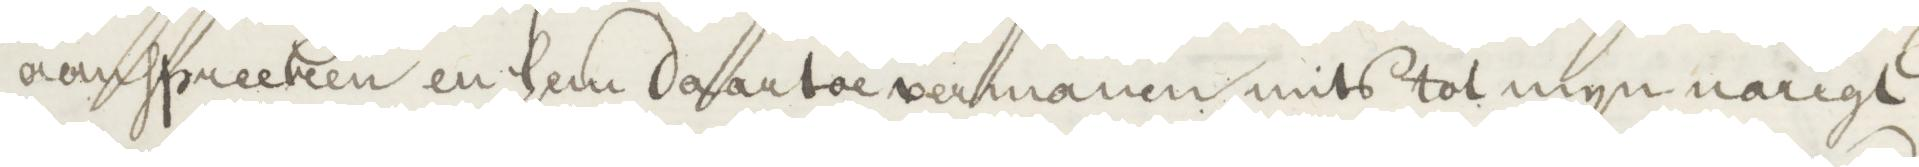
aanspreeken en hem daar toe vermanen, mits tot myn narigt
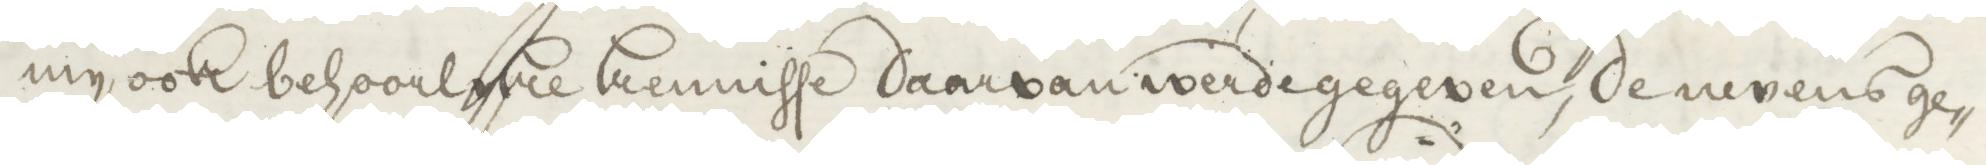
my ook behoorlyke kennisse daar van werde gegeven, de nevens ge„
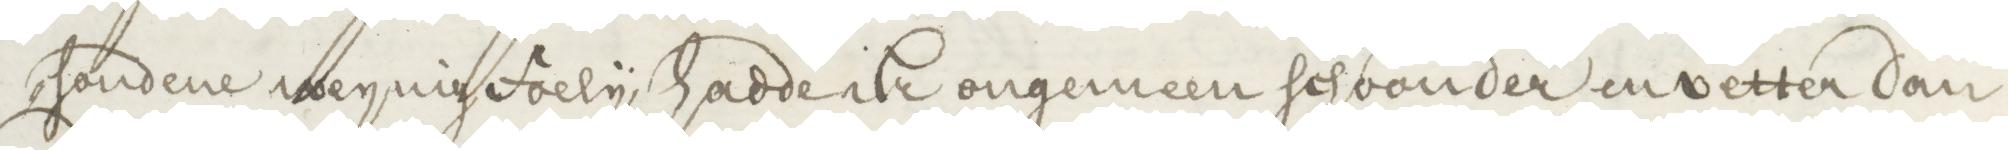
sondene weynig foelij hadde ik ongemeen schoonder en vetter dan
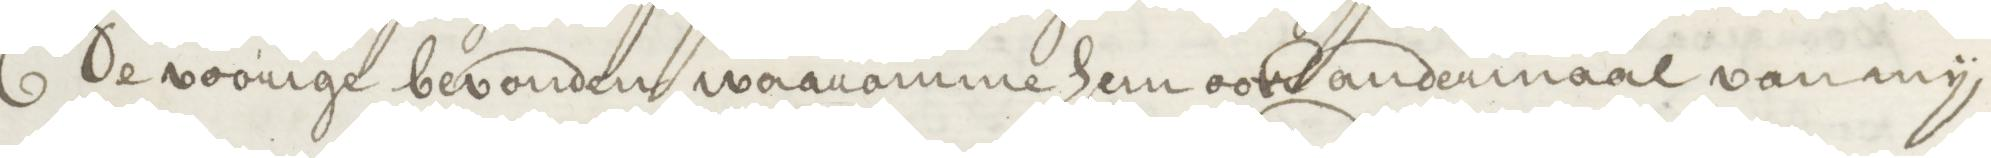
de voorige bevonden, waaromme hem ook andermaal van mij
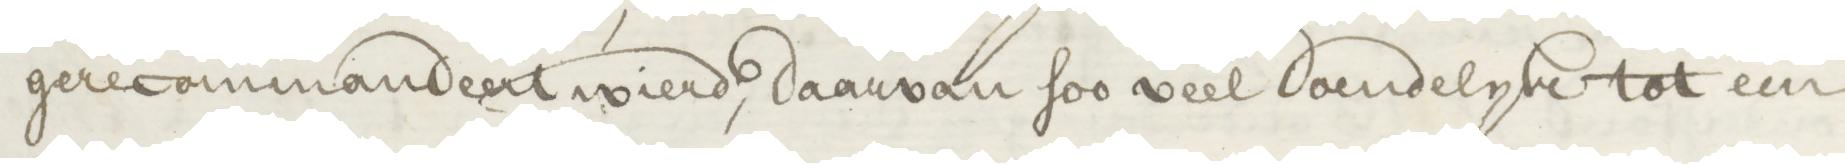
gerecommandeert wierd, daarvan soo veel doendelyk tot een
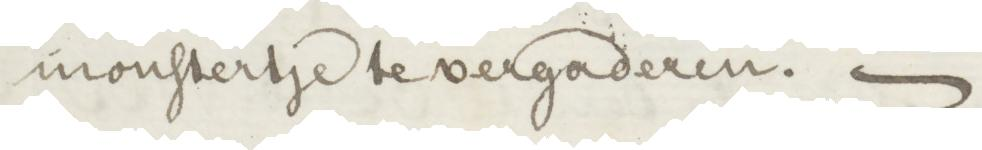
monstertje te vergaderen. —
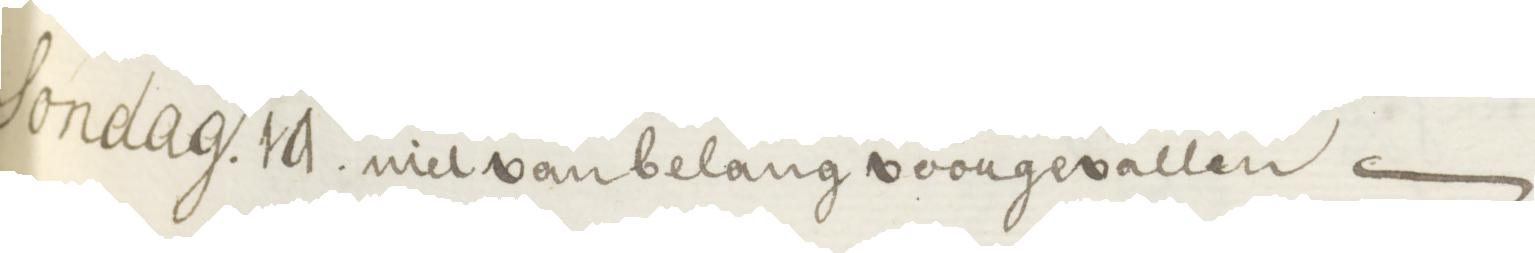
sondag. 14. niet van belang voorgevallen —
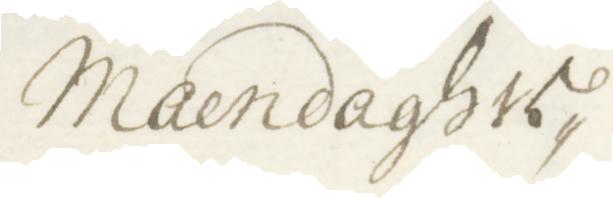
Maendagh 15„'
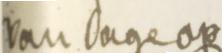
van dage og
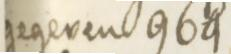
gegeven 964
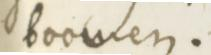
boomen.
